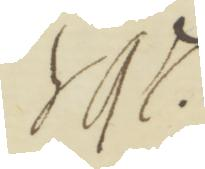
147.
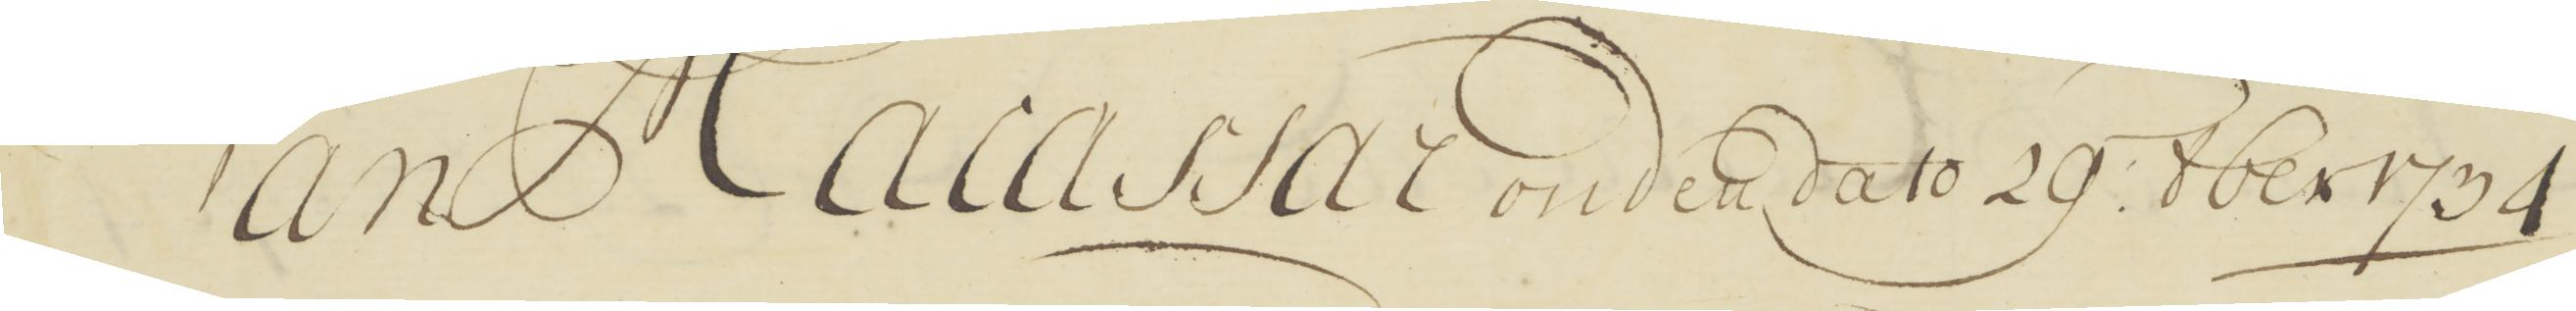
Van Macassar onder dato 29:' 8ber 1734
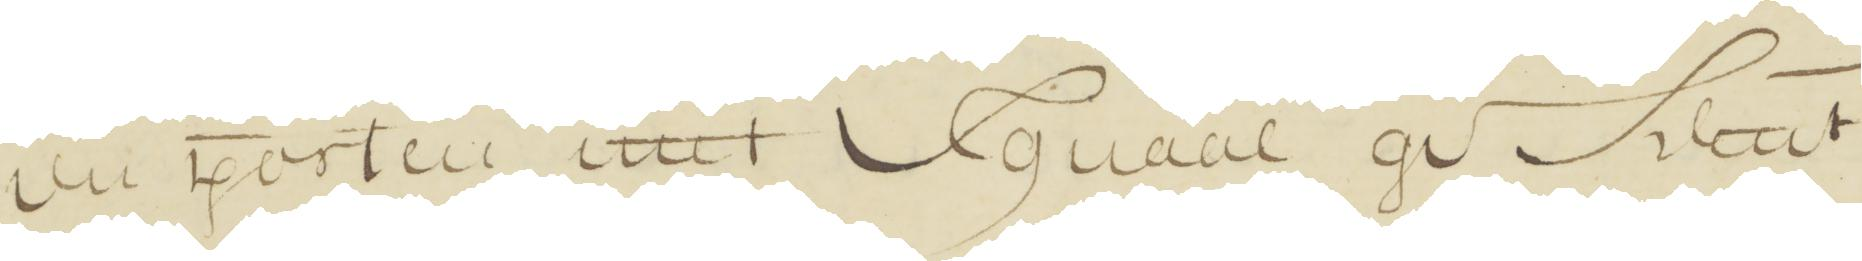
en posten met Eguaal geschut
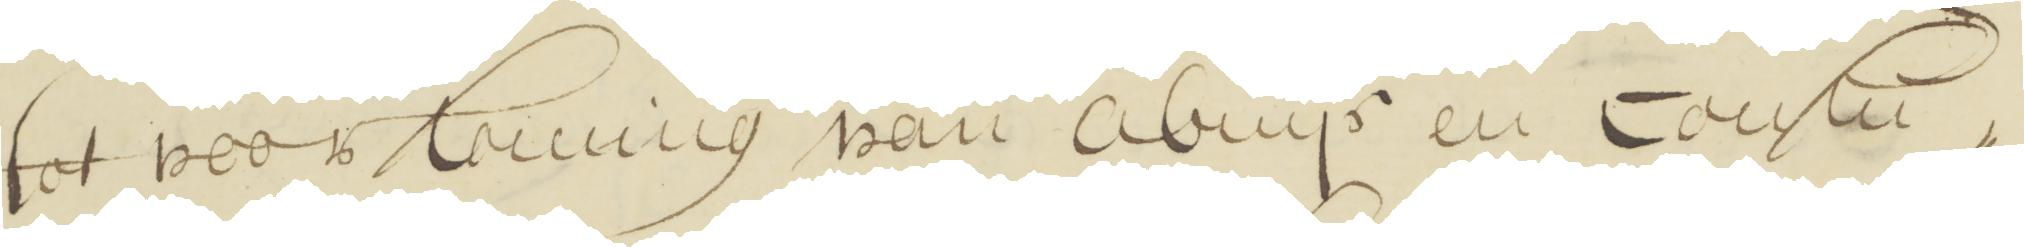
tot voorkoming van abuijs en conku„
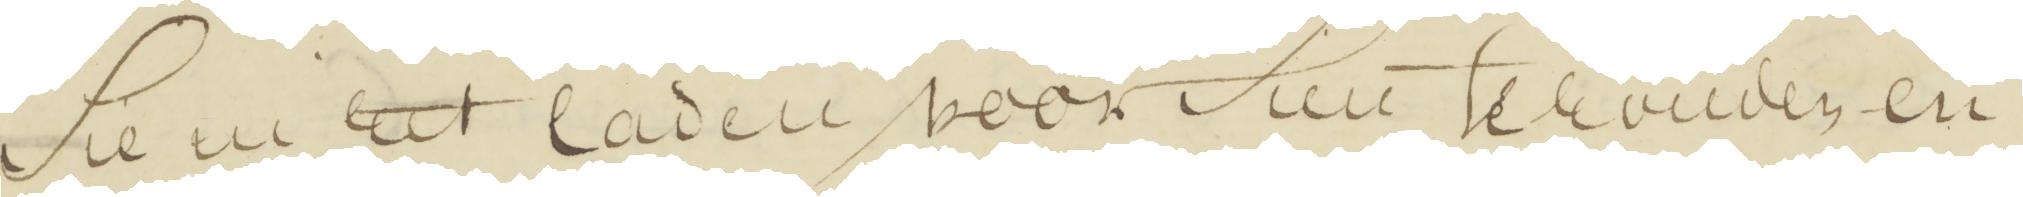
sie in het laden voorsien te houden en
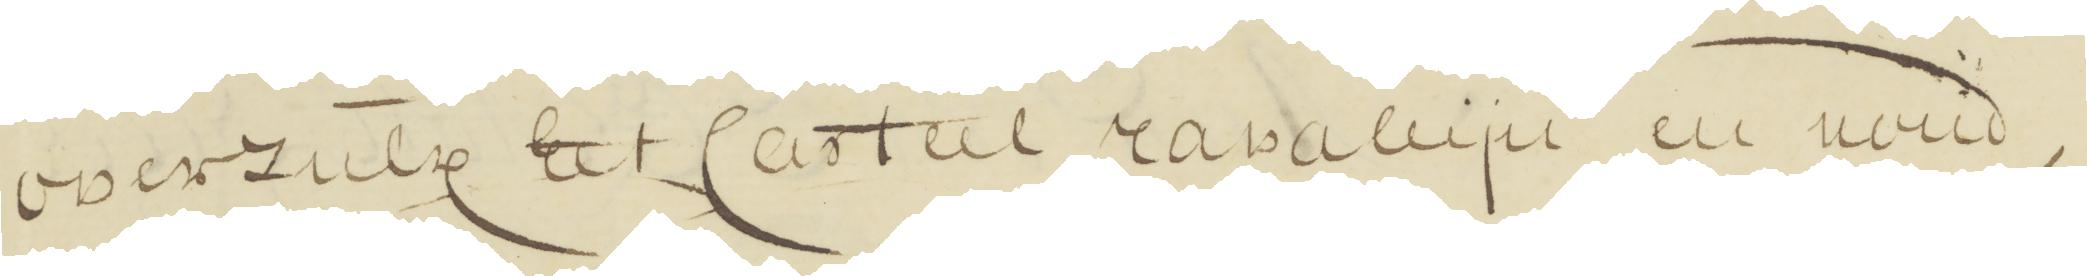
overzulx het Casteel ravaleijn en rond„
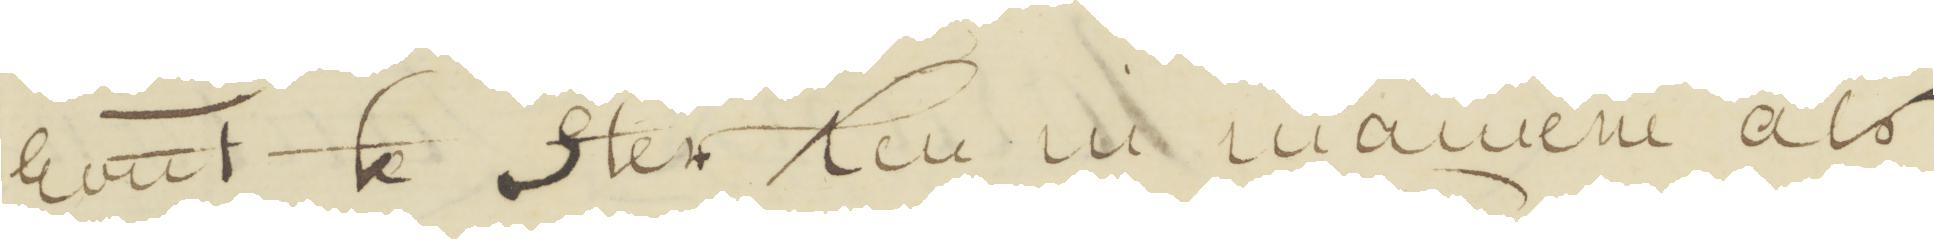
hout te sterken in maniere als
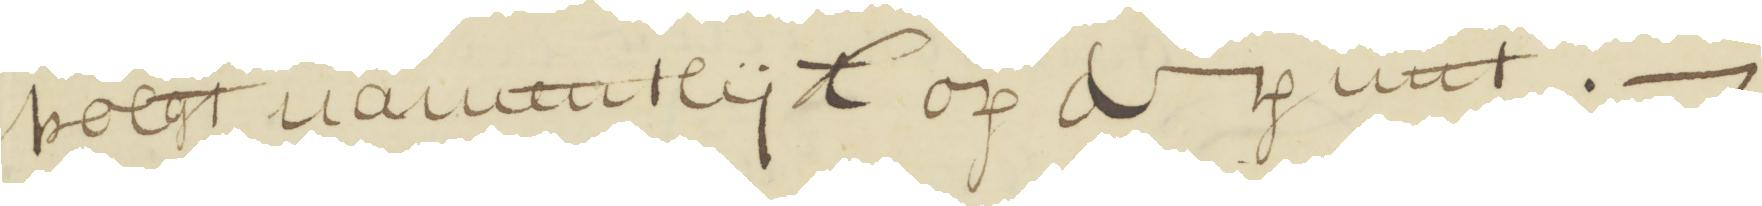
volgt namentlijk op de punt. —
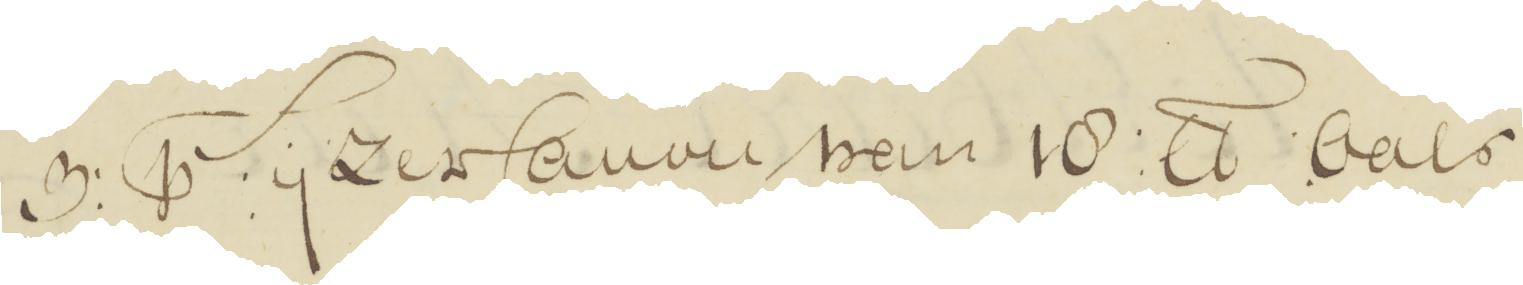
3: p:s ijzerCanon van 18: lb: bals
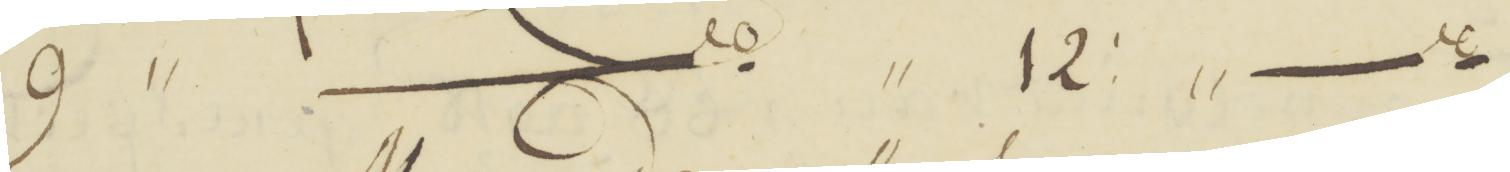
9 „ _-o „ 12: „ _-o
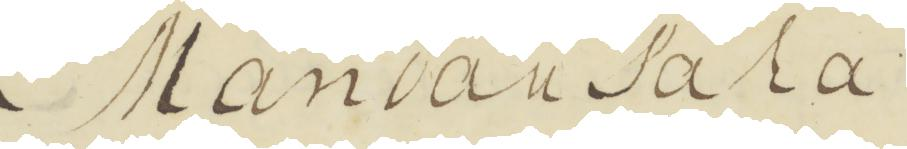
Mandarsaha
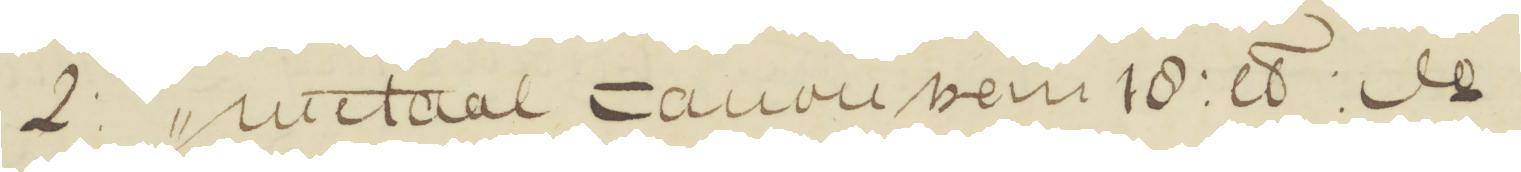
2: „ metaal canon van 18: lb: _-o
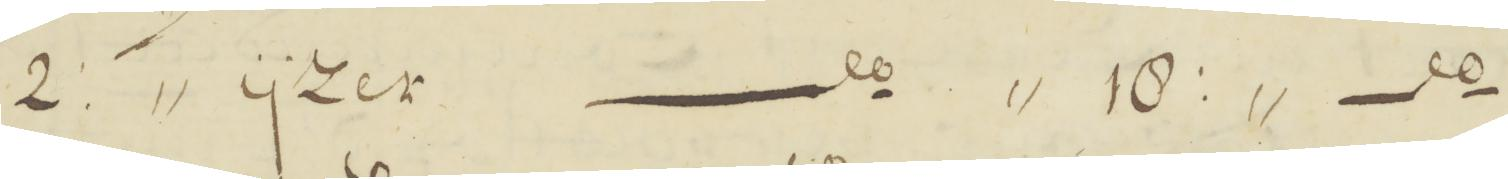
2: „ ijzer _-o „ 18: „ _-o
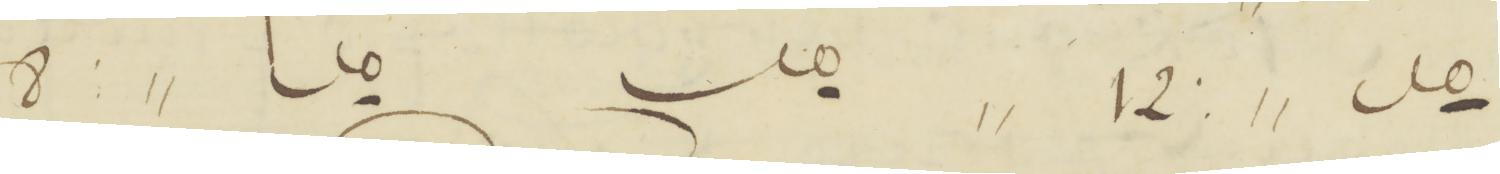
8: „ _-o _-o „ 12: „ _-o
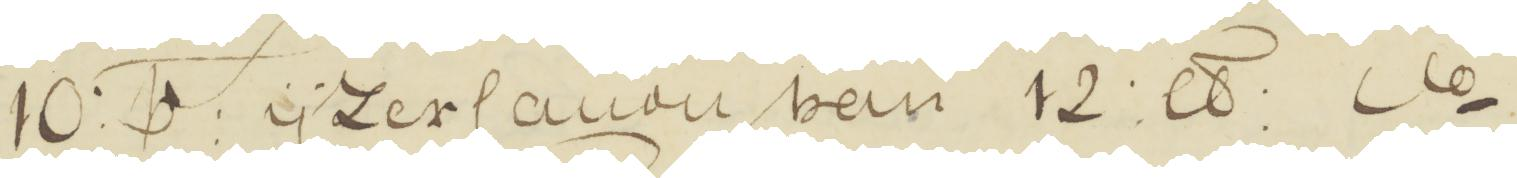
10: p:s ijzer Canon van 12: lb: _-o
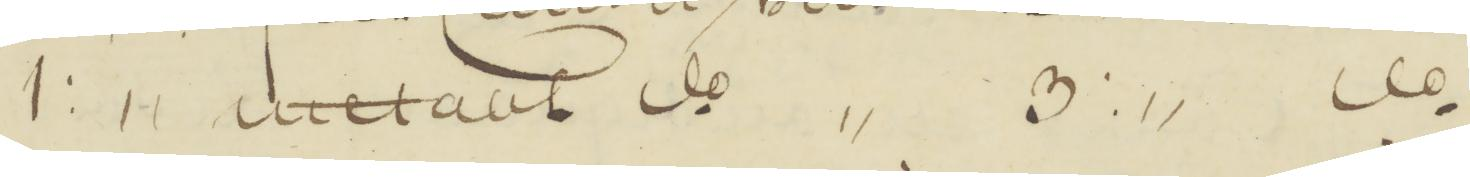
1: „ metaal _-o „ 3: „ _-o
